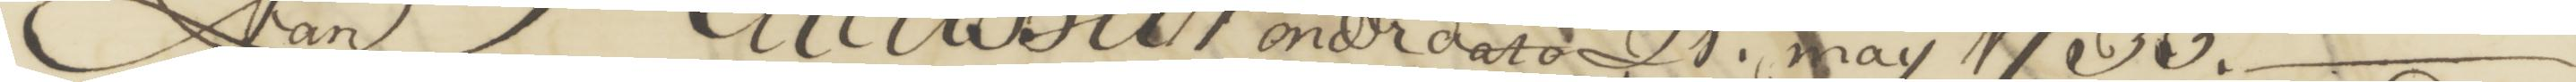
Van Macassar onder dato 21:' maij 1733. —
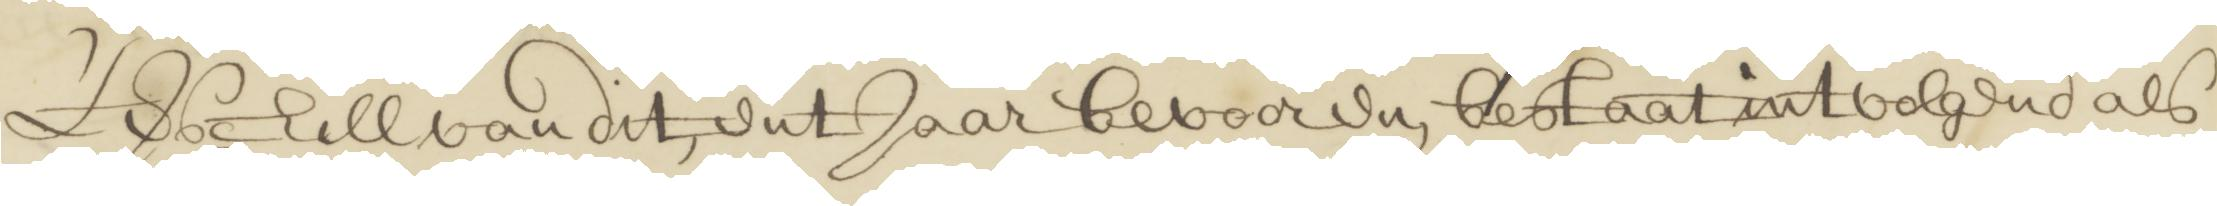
't verschill van dit, en’t Jaar bevooren, bestaat in't volgend'als
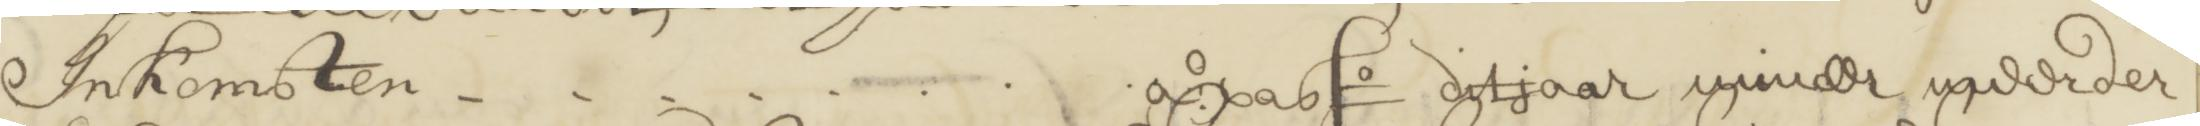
Inkomsten - - - - - . . . a:o pass=o dit jaar minder meerder
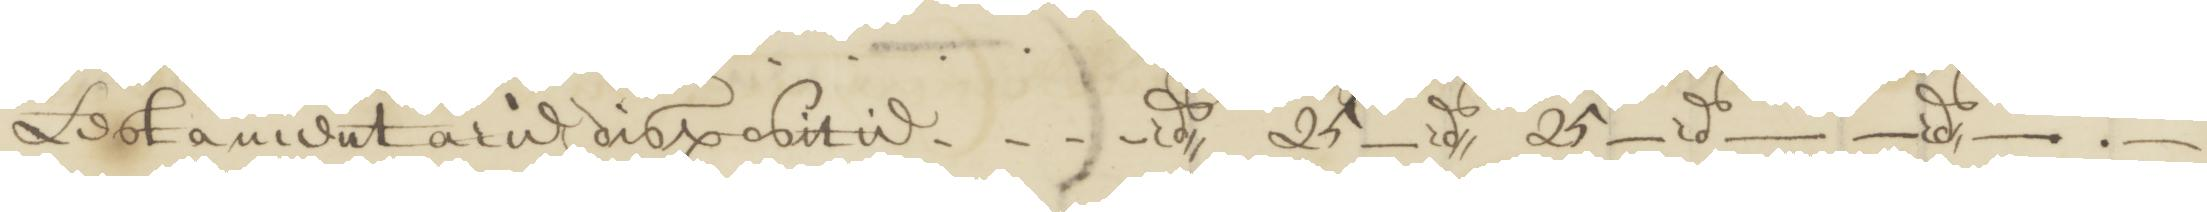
testamentatie dispositie - - - - rd„s 25 — rd„s 25 — rds — — rd„s — . —
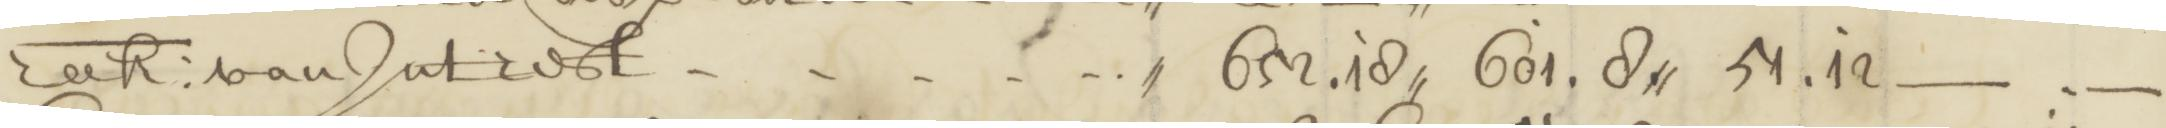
reek: van Jntrest - - - - - - „ 652. 18 „ 601. 8„ 51. 12 —. —
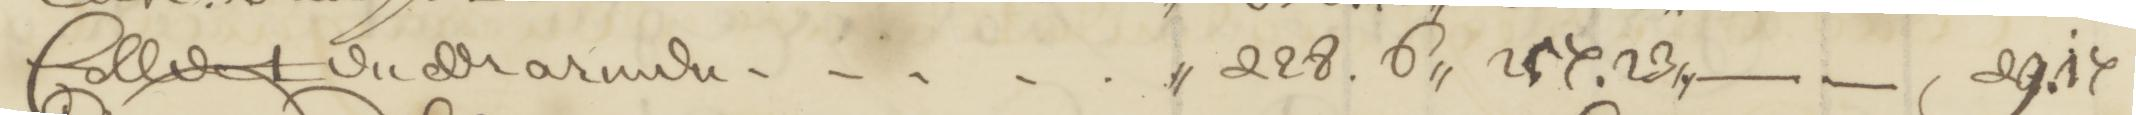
Collecten der armen - - - - . .„ 228. 6 „ 257. 23„ — — 29. 17
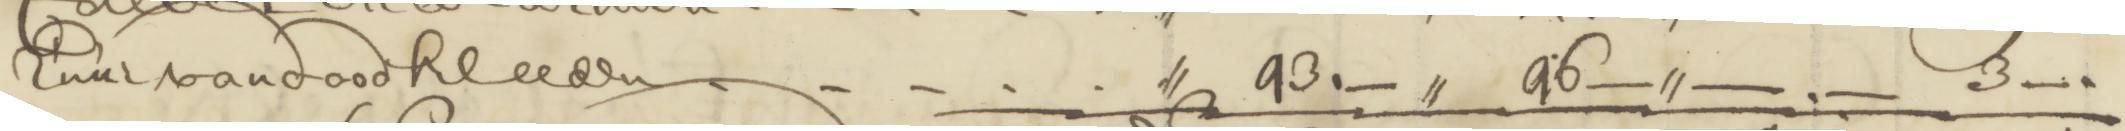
huur van dood kleeden - - - - - „ 43. — „ 46 — „ — . — 3 — .
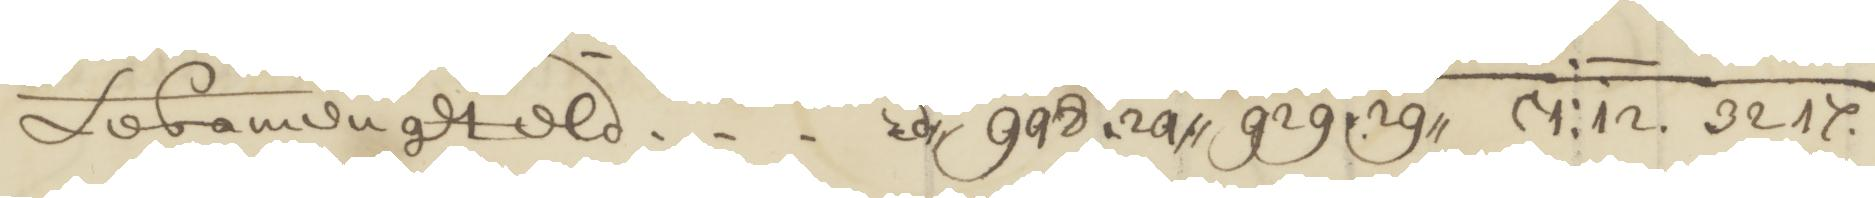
tesamen geteld - - - rd„s 948. 29 „ 929. 29„ 51:12. 32 17.
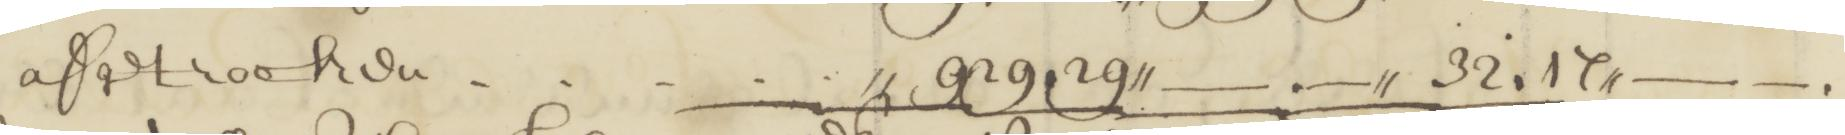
afgetrocken - - - - - „ 929. 29 „ —. — „ 32 . 17„ — —.
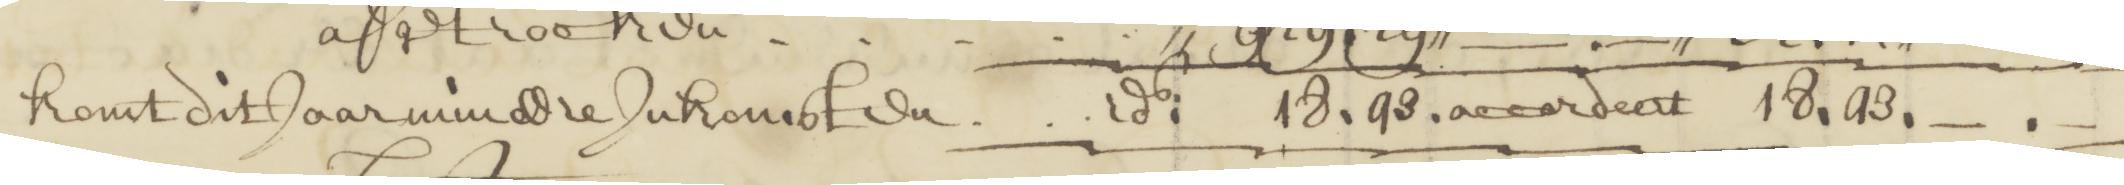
komt dit Jaar mindere Jnkomsten . . . rd:s 18. 43. accordeert 18. 43. — . —
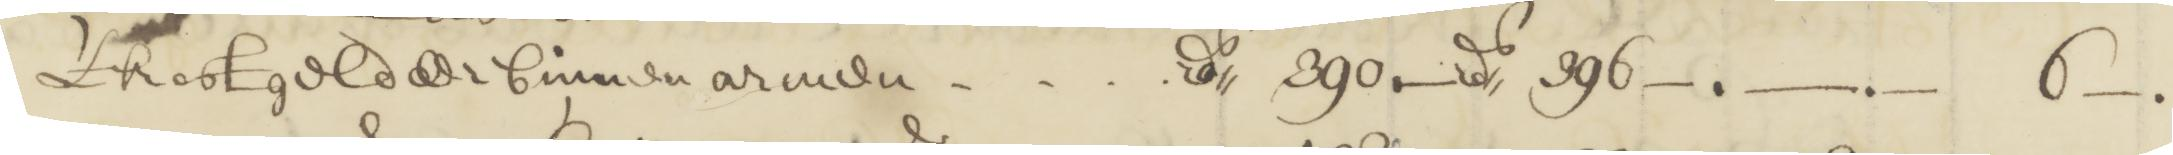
't kostgeld der binnen armen - - . . rd„s 390.— rd„s 396 — . — . — 6 —
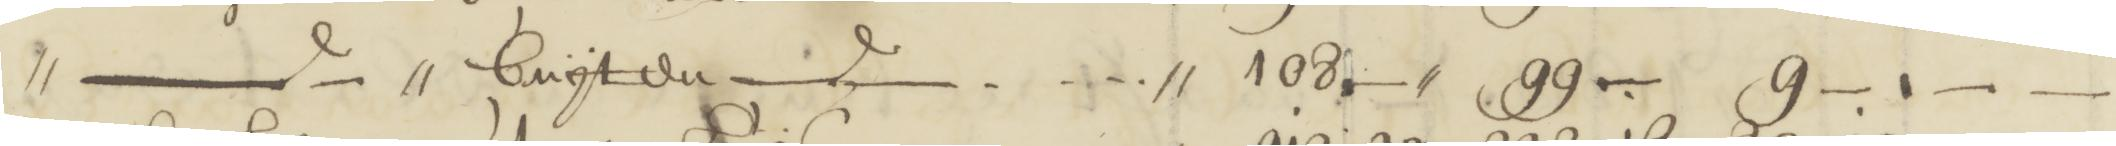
„ _–o „ buijten _–o - - - . „ 108.— „ 99 — 9 — . — —
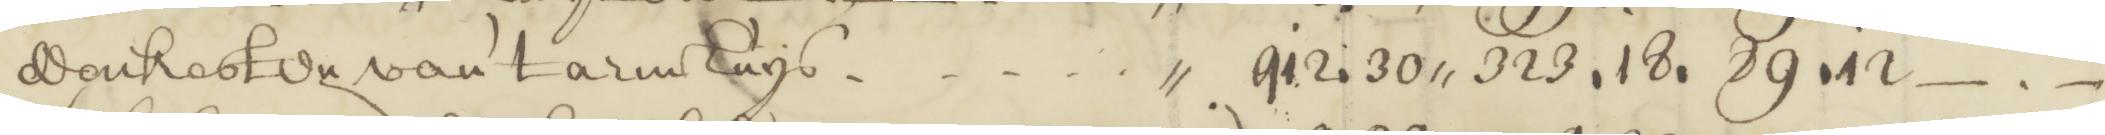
de onkosten van ’t armhuijs - - - - . „ 412. 30 „ 323. 18. 89. 12 — . —
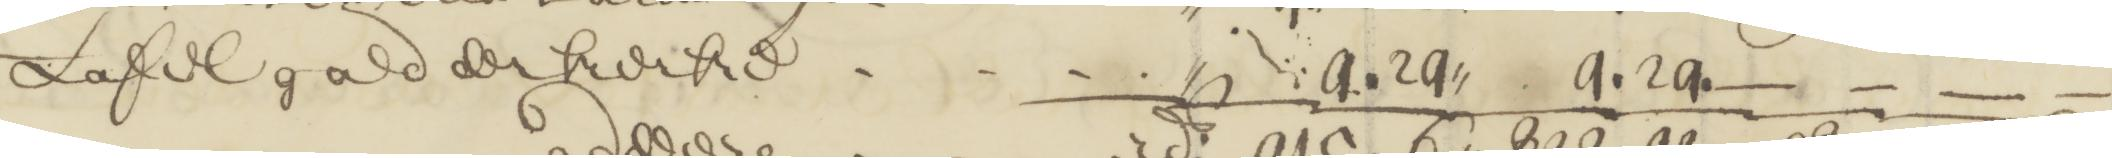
tafel goed der kerke - - - . „ 4. 24„ 4. 24. — — — —
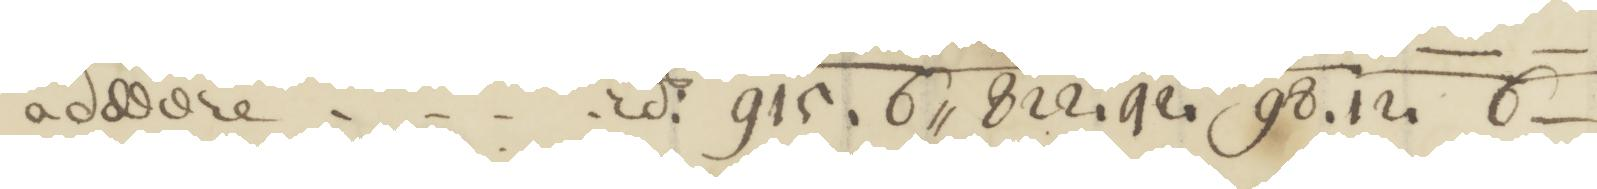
addeere - - - - rd:s 915. 6 „ 822. 92. 98. 12. 6 —
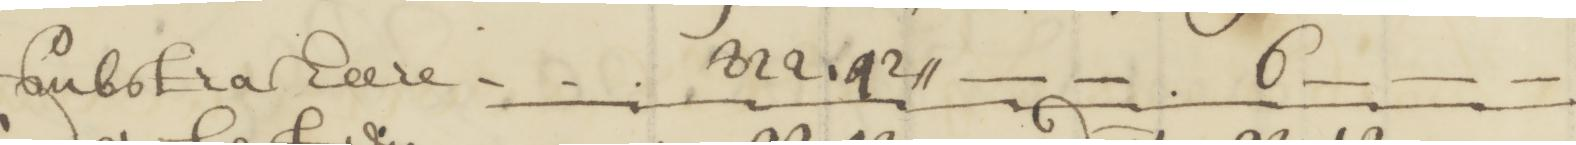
substraheere - - . 822.42 „ — — . 6 — — —
